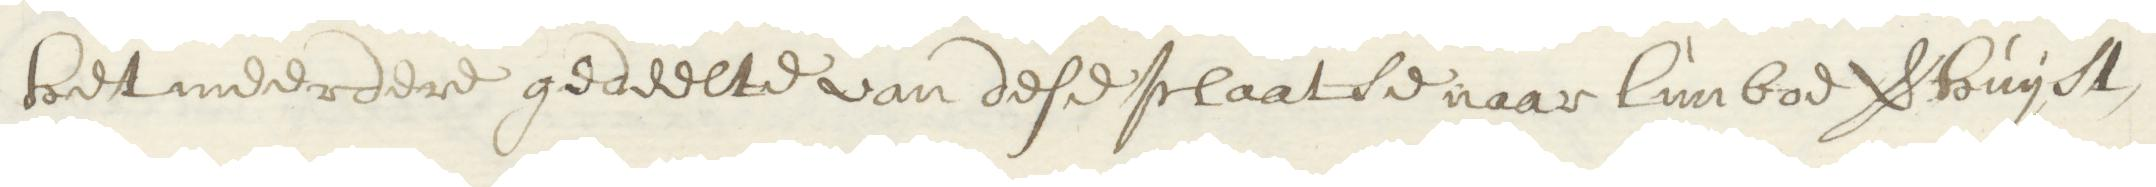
het meerdere gedeelte van dese plaatse naar limboe verhuijst,
